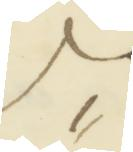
D„o
